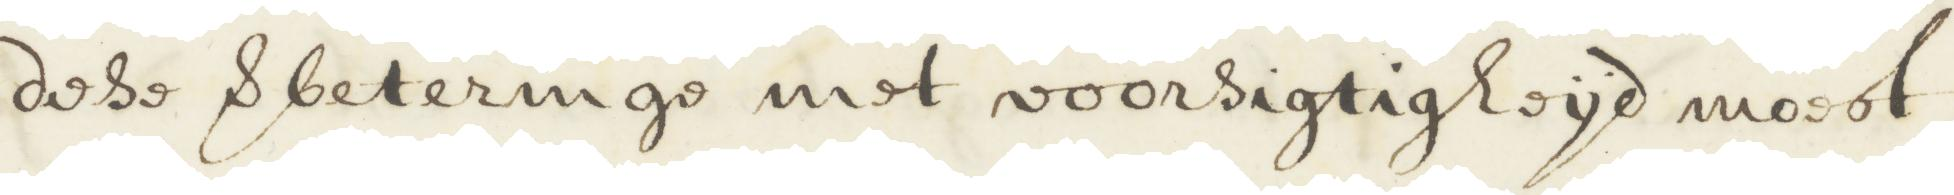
dese verbeteringe met voorsigtigheijd moest
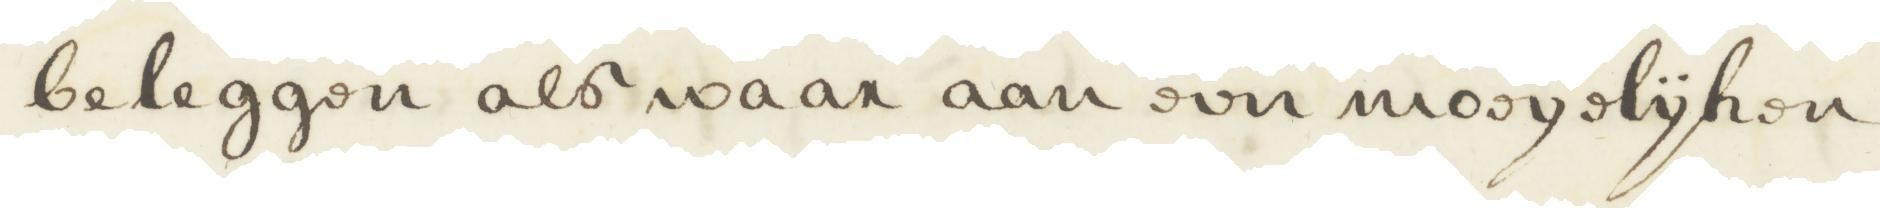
beleggen als waar aan een moeijelijken
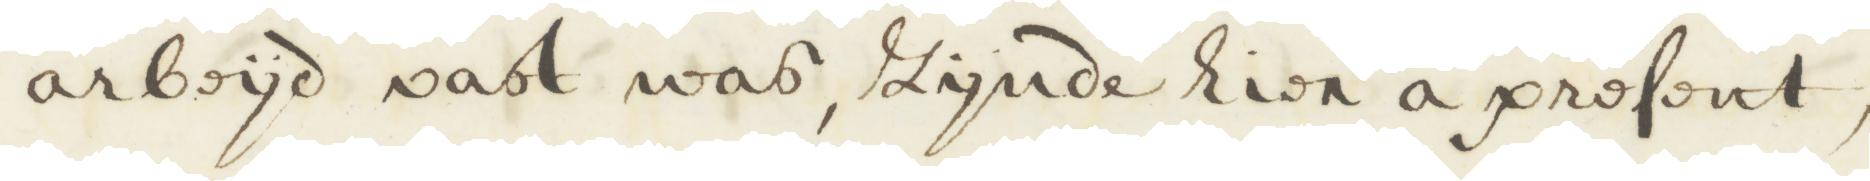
arbeijd vast was, zijnde hier à present,
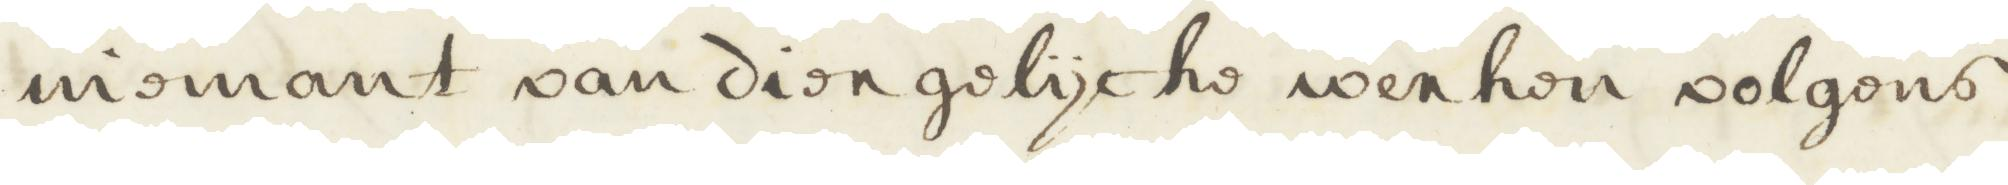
niemant van dier gelijcke werken volgens
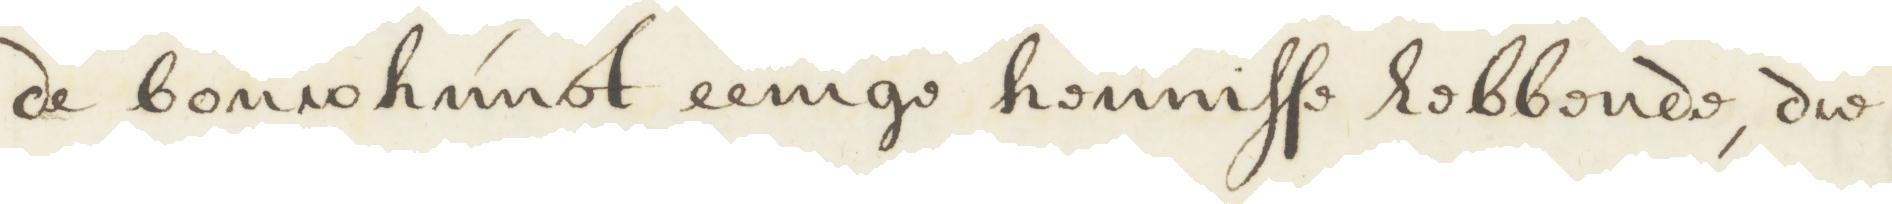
de bouwkunst eenige kennisse hebbende, die
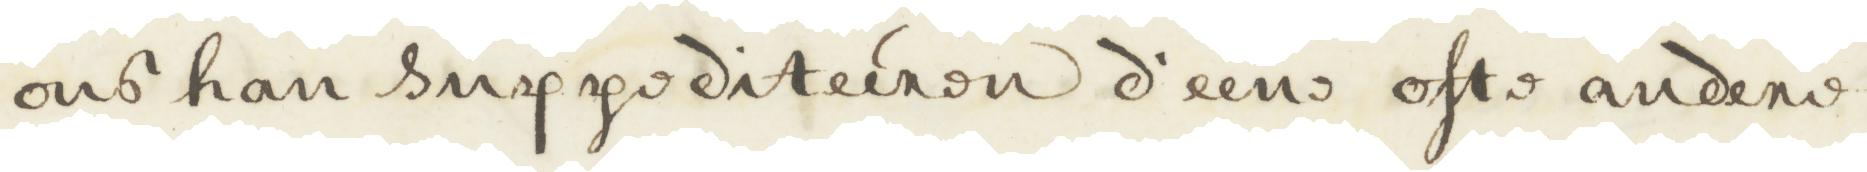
ons kan suppediteeren d’ eene ofte andere
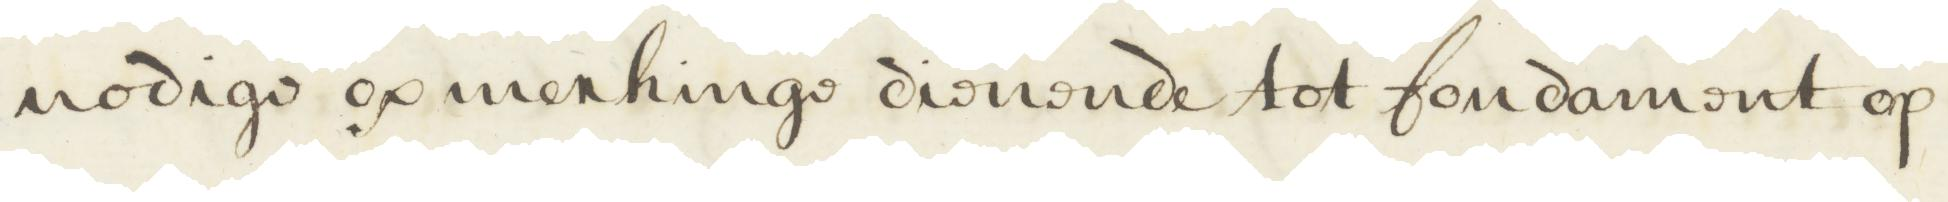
nodige op merkinge dienende tot fondament op
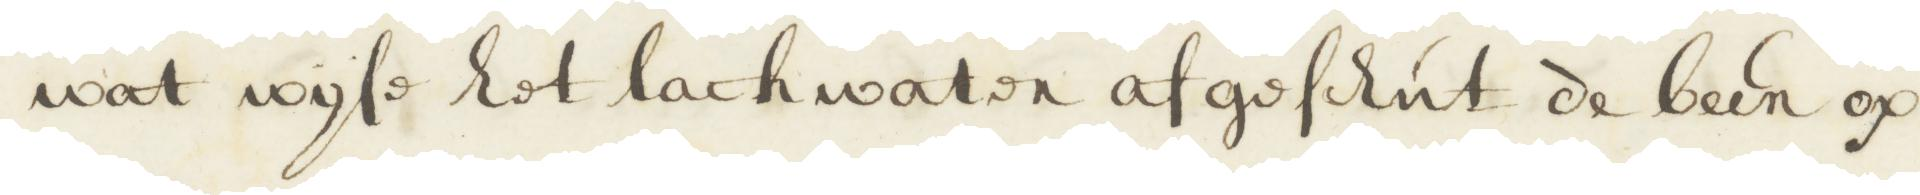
wat wijse het lackwater afgeschut de beer op
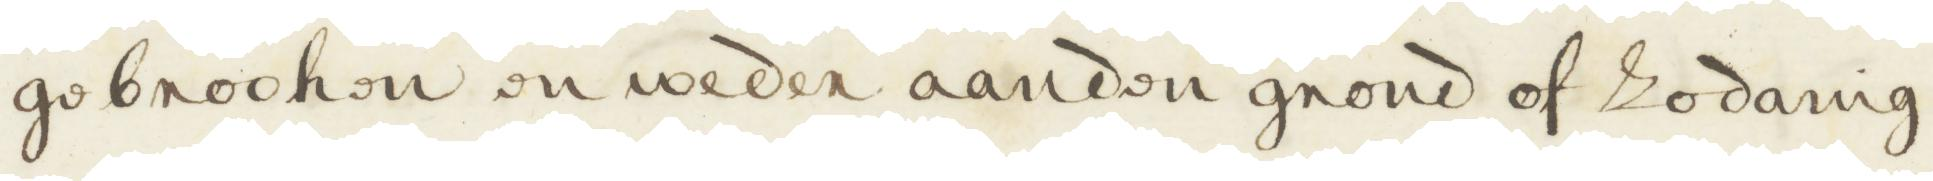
gebrooken en weder aan den grond of zodanig
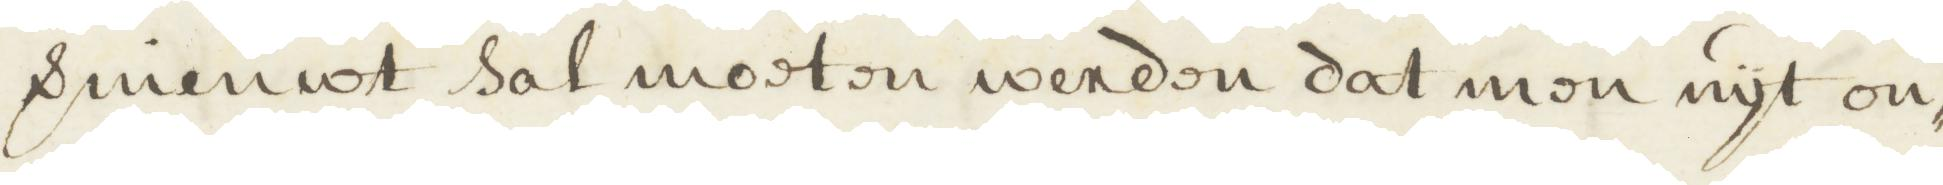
vernieuwt sal moeten werden dat men uijt on„
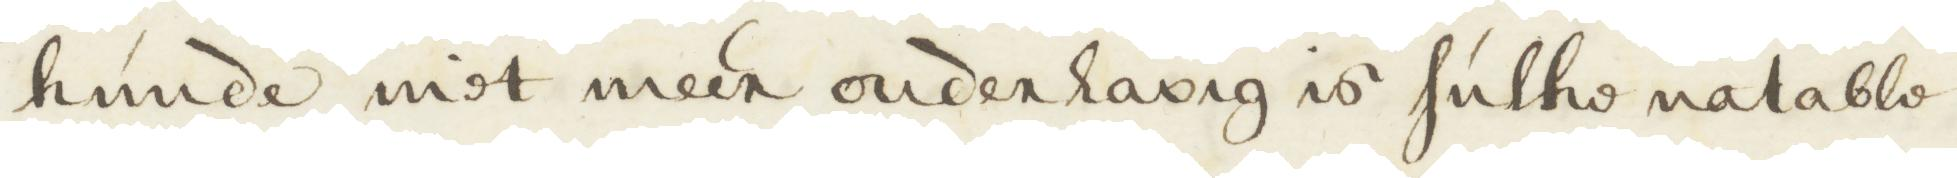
kunde niet meer onderhavig is sulke natable
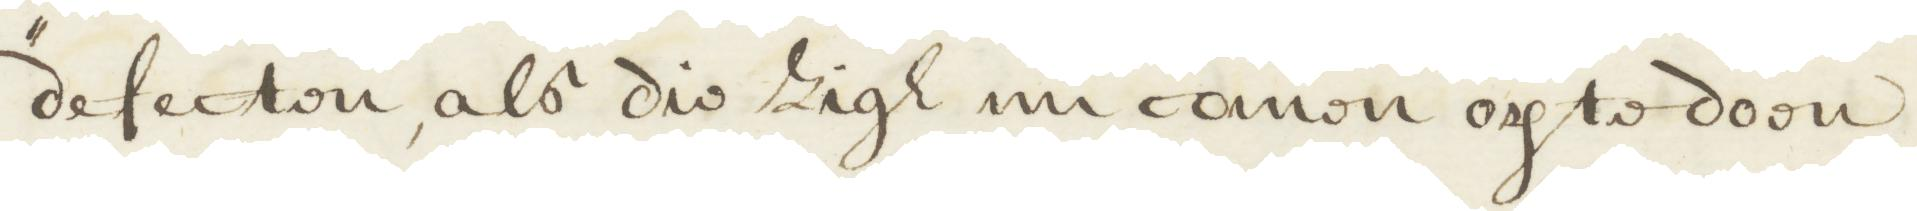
defecten, als die zigh nu comen op te doen
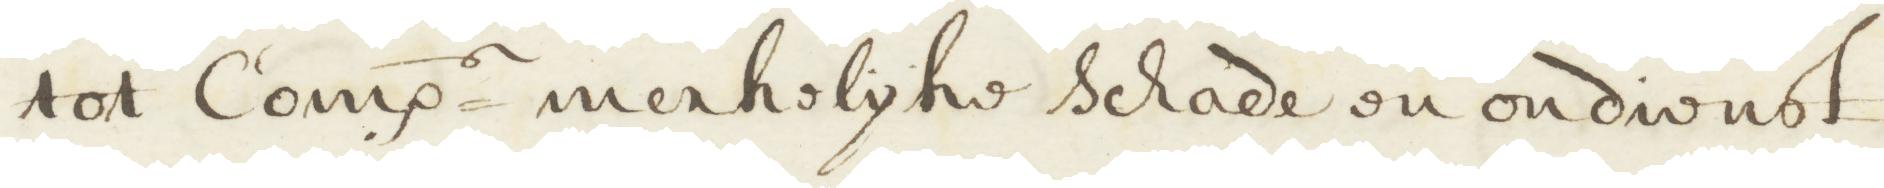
tot Comp=s merkelijke schade en ondienst
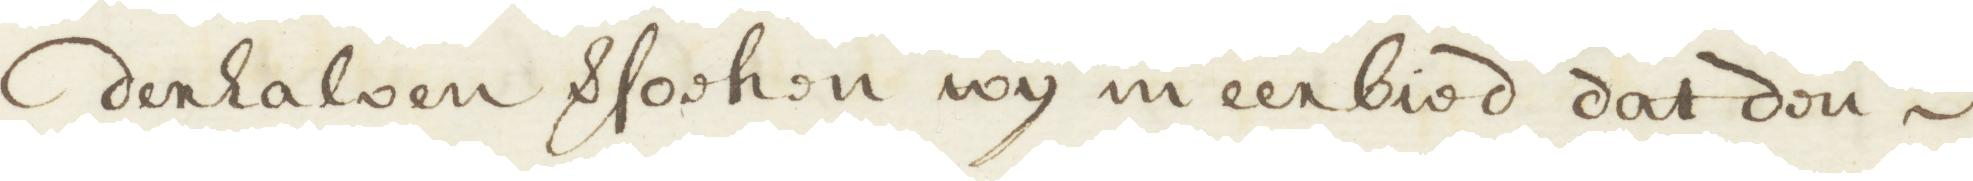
derhalven versoeken wij in eerbied dat den E
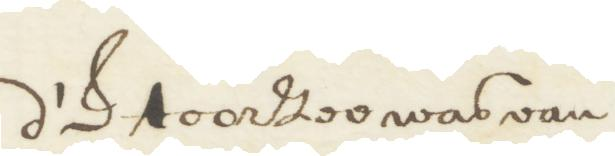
d’E toorzee was van
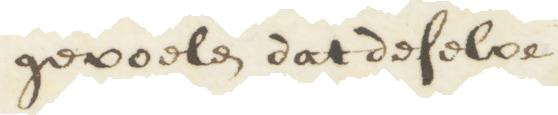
gevoelen dat deselve
